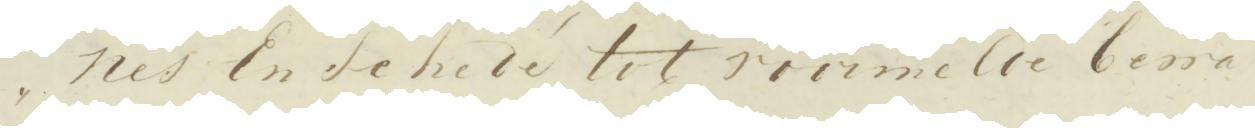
„nes Enschedé tot voormelde bewa
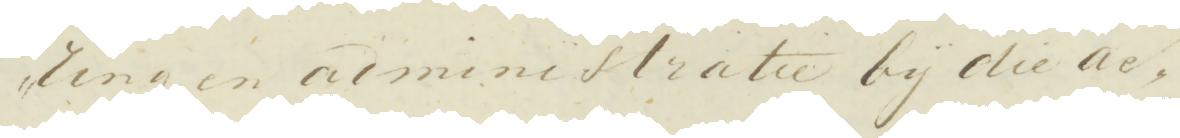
„ring en administratie bij die ac„
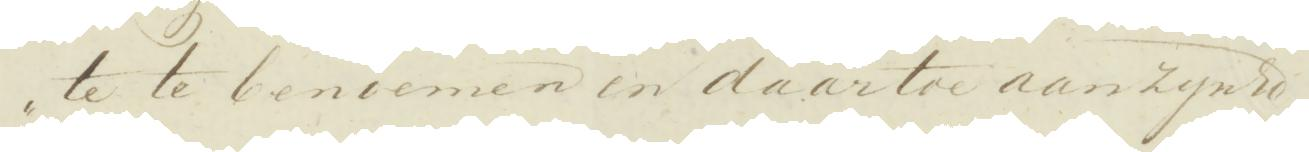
„te te benoemen en daartoe aan zyn Ed
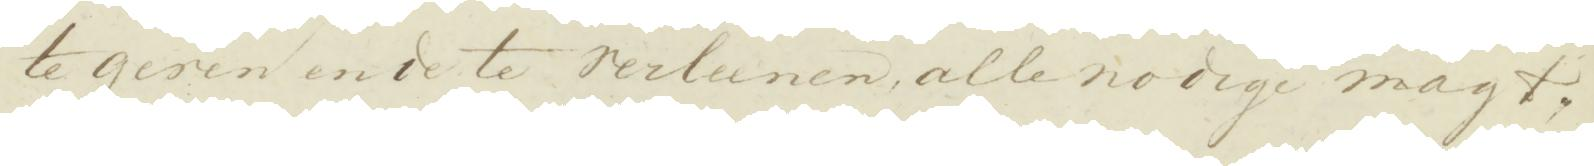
te geven ende te verleenen, alle nodige magt,
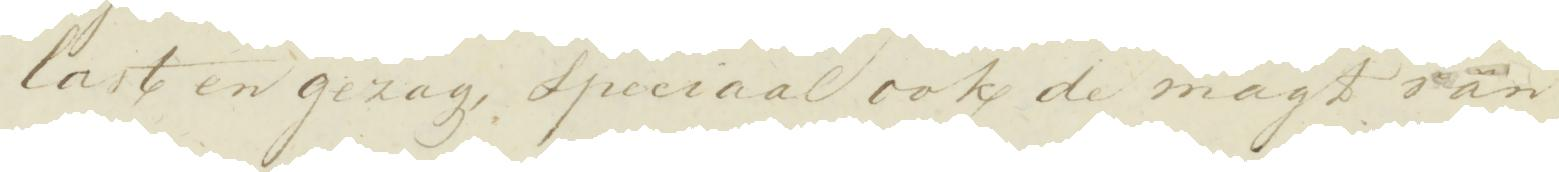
last en gezag, speciaal ook de magt van
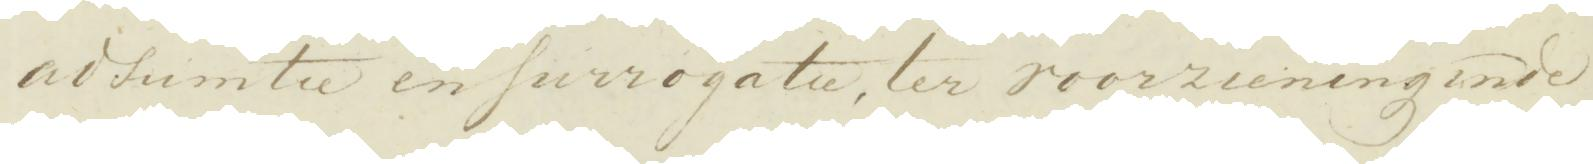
adsumtie en surrogatie, ter voorziening in de
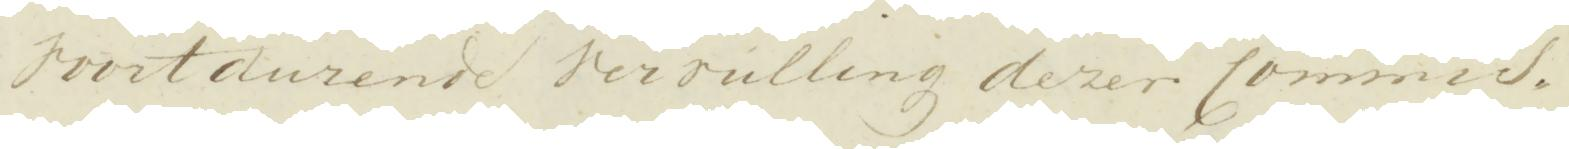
voortdurende vervulling dezer Commis„
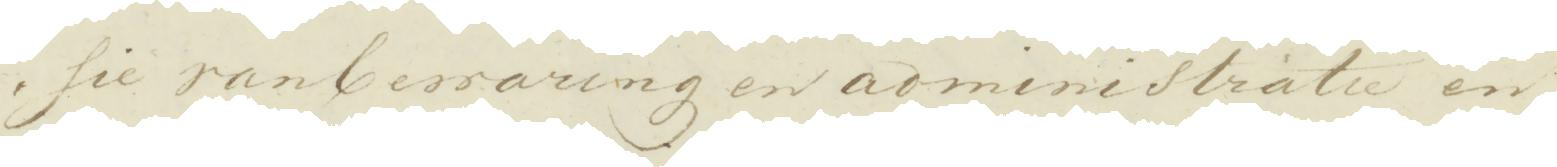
„sie van bewaring en administratie en
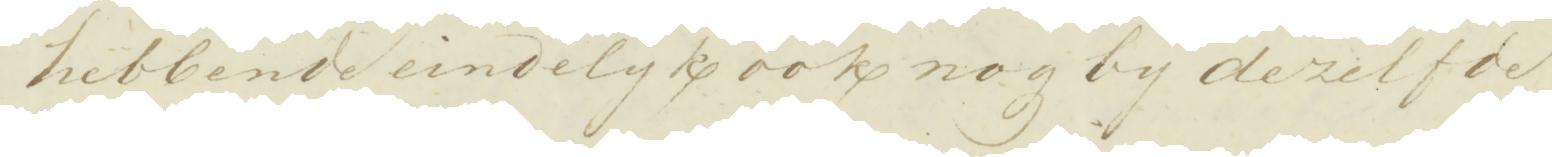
hebbende eindelijk ook nog bij dezelfde
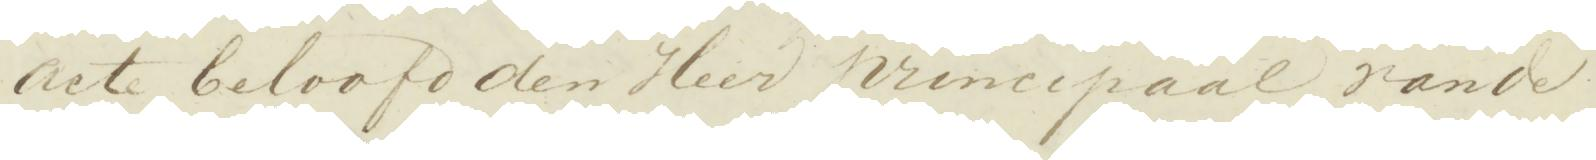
Acte beloofd den Heer Principaal van de
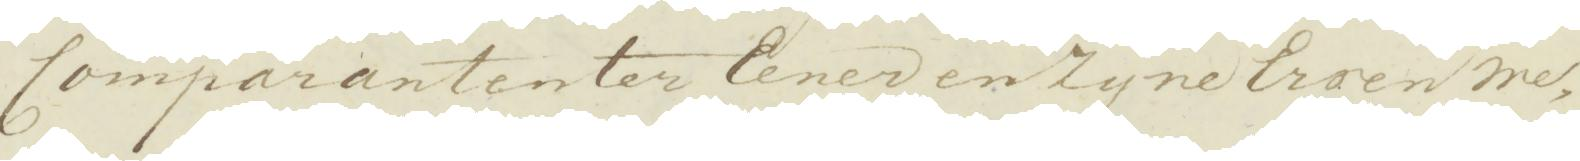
Comparanten ter Eener en zijne Erven we„
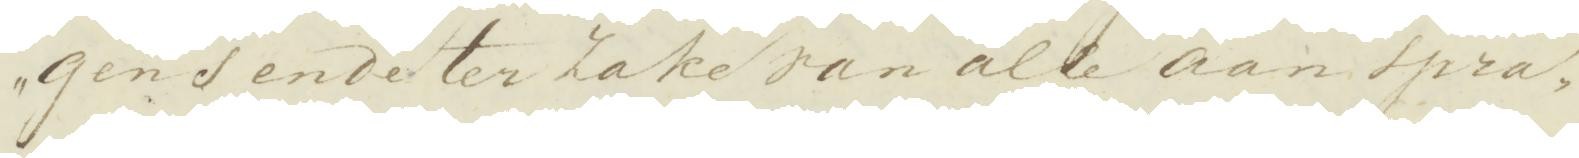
„gens ende ter zake van alle aan spra„
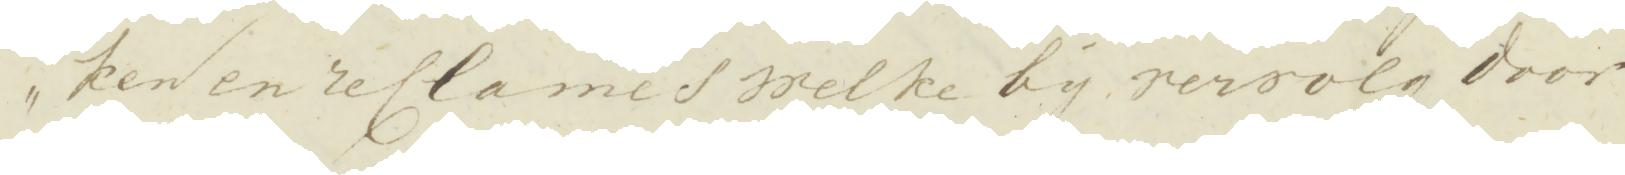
„ken en reclames welke bij vervolg door
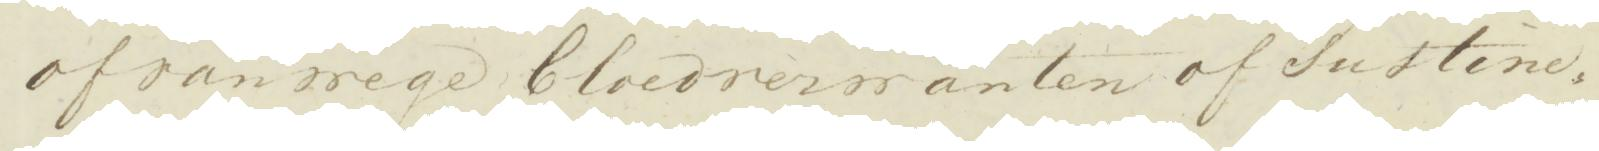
of vanwege bloedverwanten of sustine„
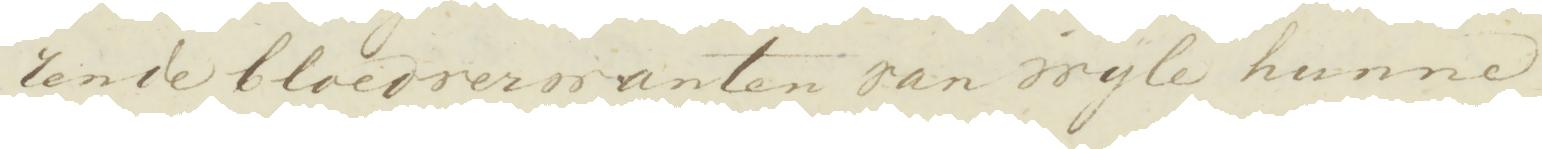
rende bloedverwanten van wijle hunne
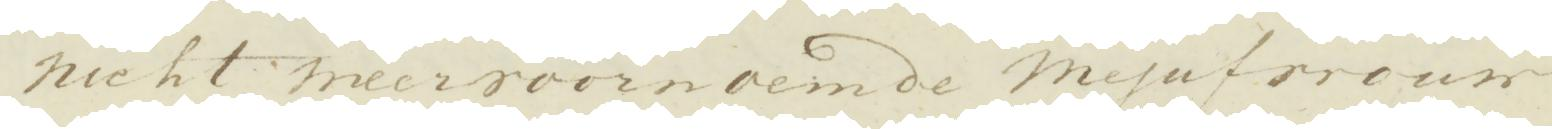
nicht meervoornoemde Mejufvrouw
